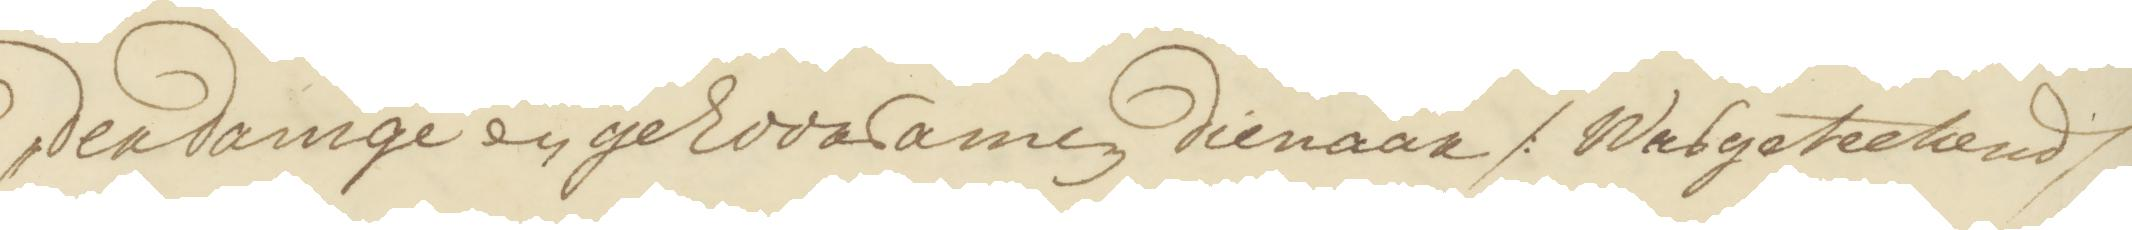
derdanige en gehoorsamen dienaar /:was geteekend/
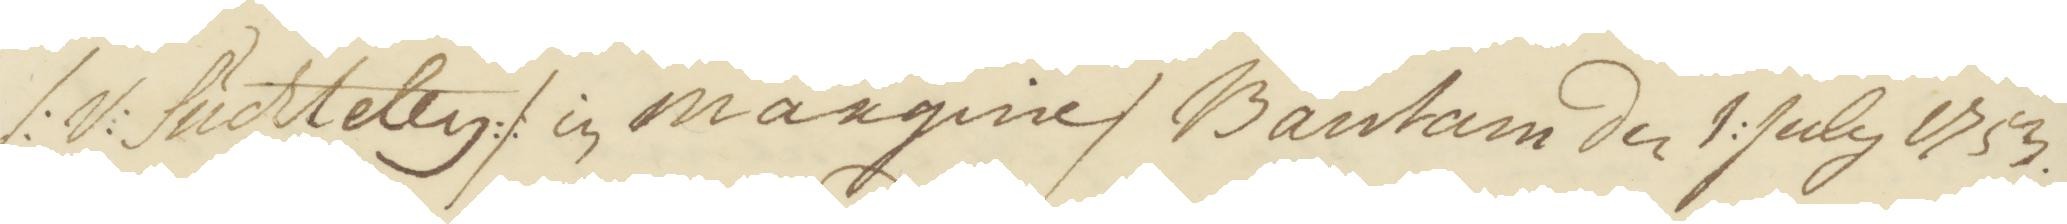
J:v: suchtelen:/: in margine/ Bantam den 1: Julij 1753.
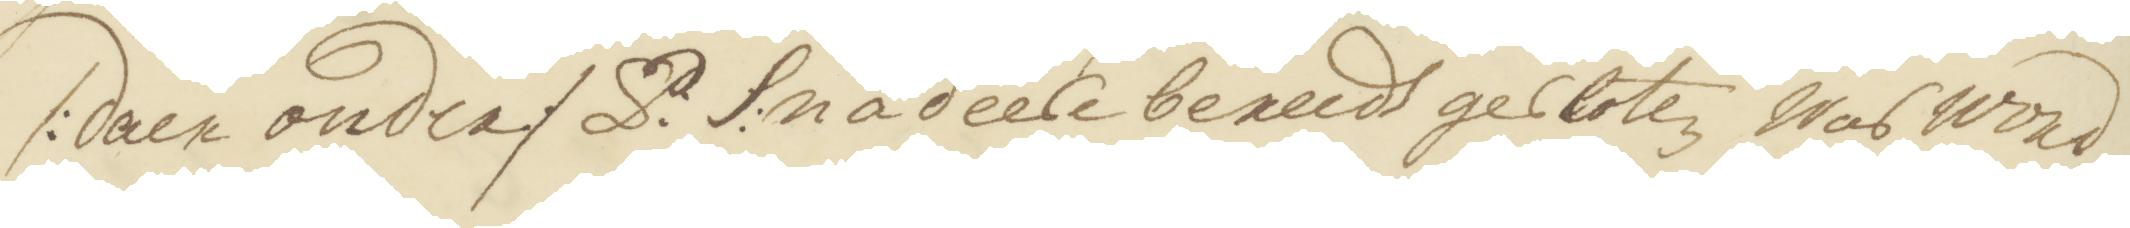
/:daer onder:/ P: s: nadeese bereeds gesloten was word
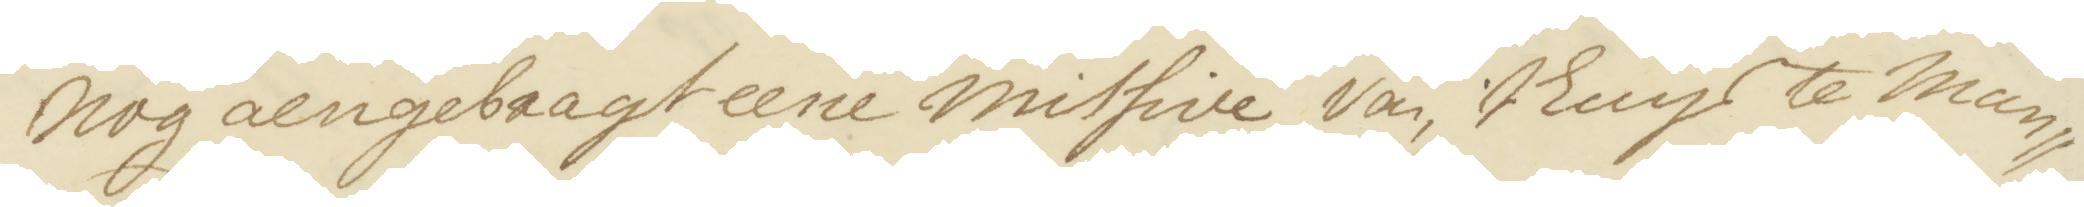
nog aengebragt eene missive van 't huijs te man„
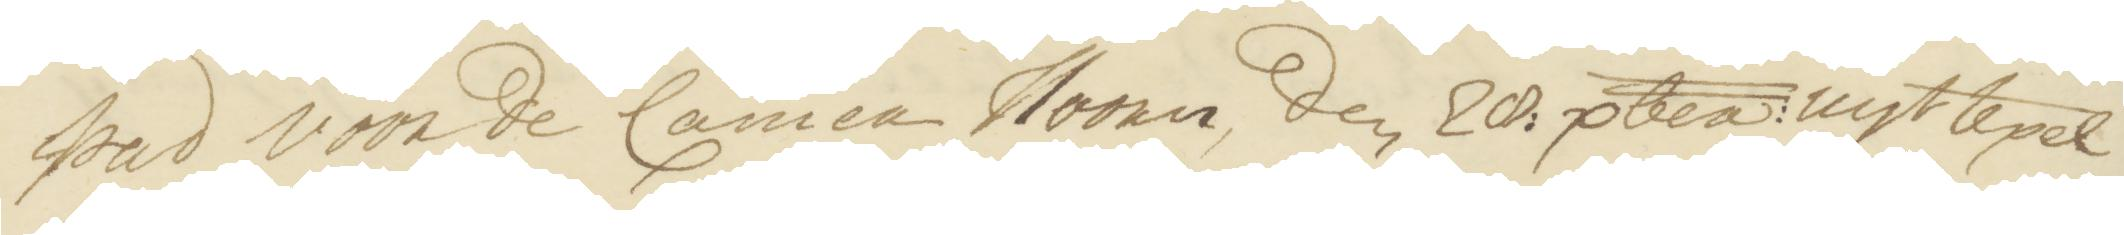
pad voor de Camer Hoorn, den 28: xber: uyt texel
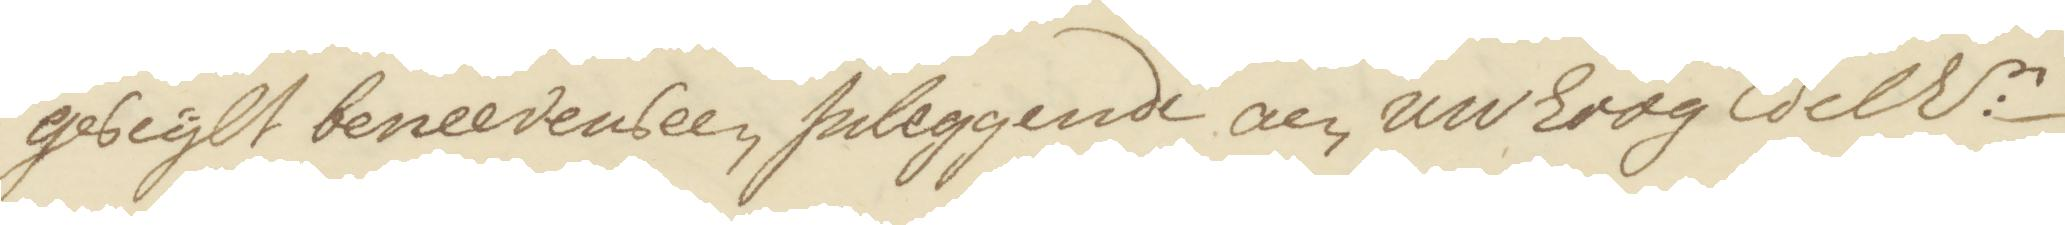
geseijlt beneevens een Jnleggende aen uw hoog Edelh:n
